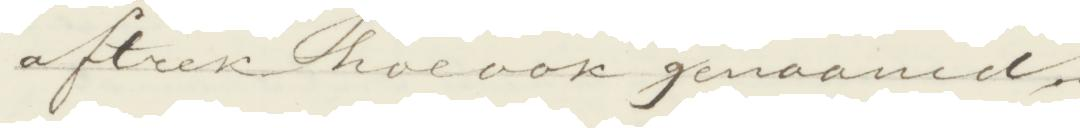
aftrek hoe ook genaamd.
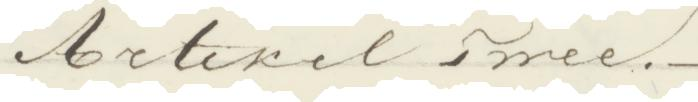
Artikel Twee. —
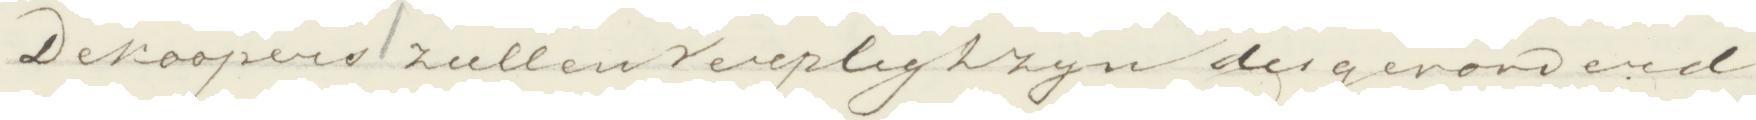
De koopers zullen Verpligt zyn des gevorderd
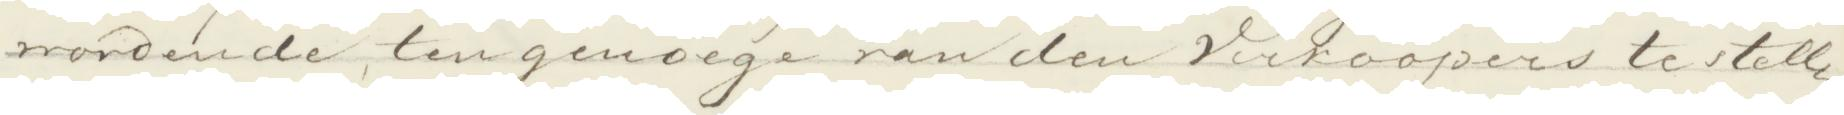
wordende, ten genoege van den Verkoopers te stellen
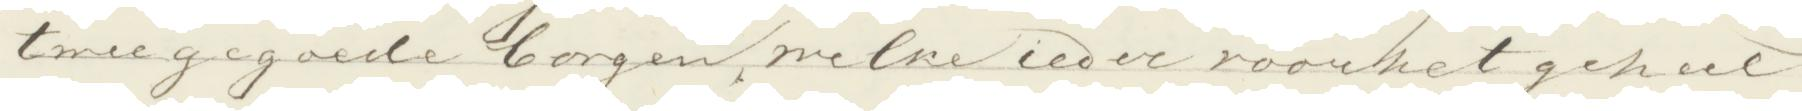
twee gegoede borgen, welke ieder voor het geheel
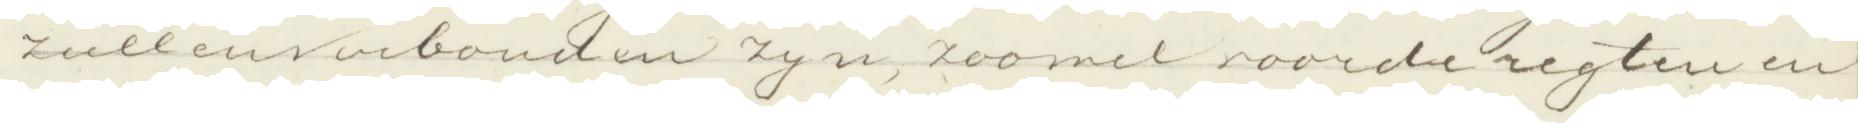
zullen verbonden zyn, zoowel voor de regten en
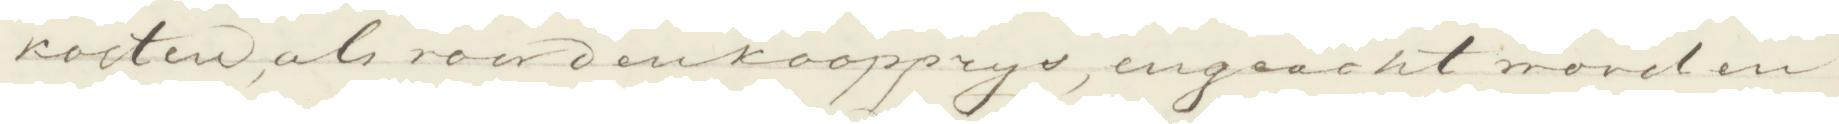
kosten, als voor den koopprys, en geacht worden
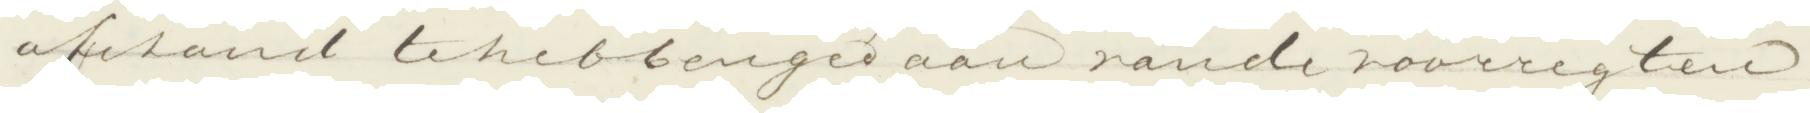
afstand te hebben gedaan vande voorregten
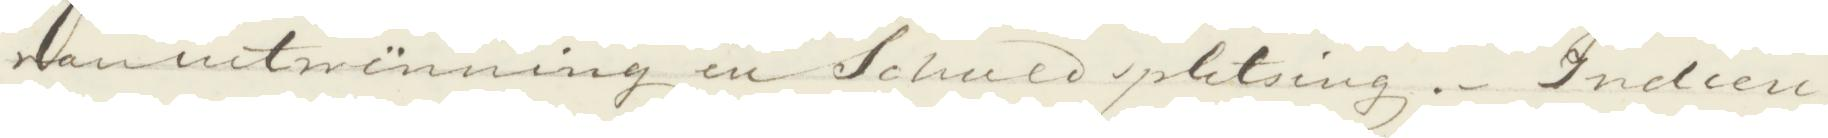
van uitwinning en Schuld splitsing. — Indien
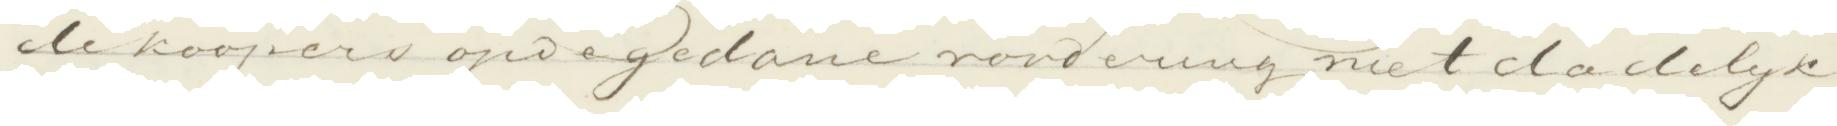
de koopers opde gedane vordering niet dadelyk
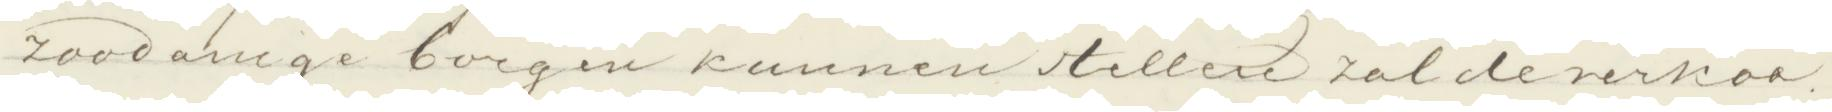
zoodanige borgen kunnen stellen zal de verkoo„
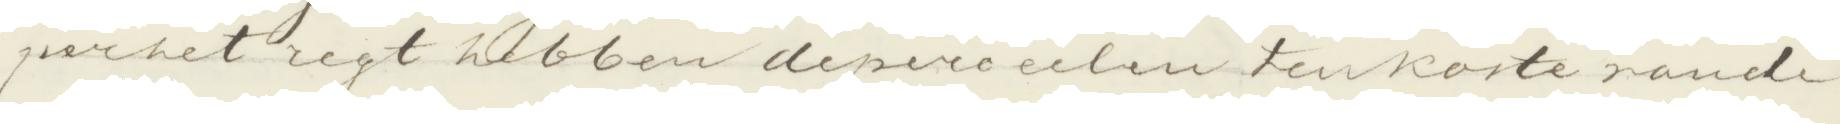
per het regt hebben de perceelen ten koste vande
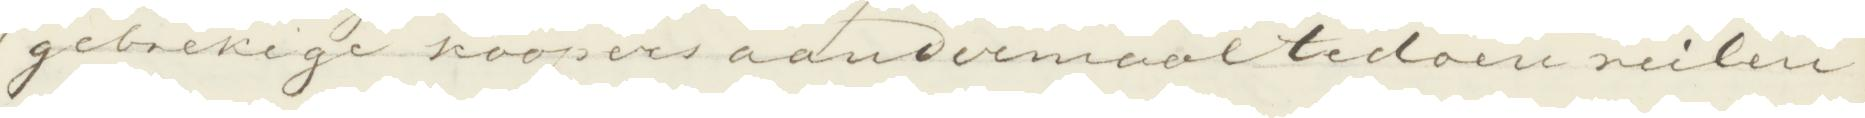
gebrekige koopers aandermaal te doen veilen
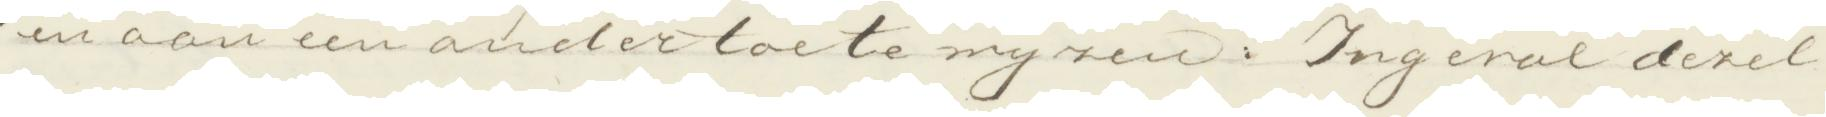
en aan een ander toe te wyzen: Ingeval dezel
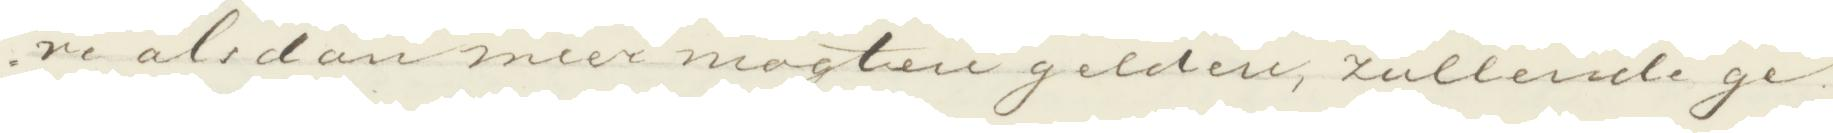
„ve als dan meer mogten gelden, zullende ge
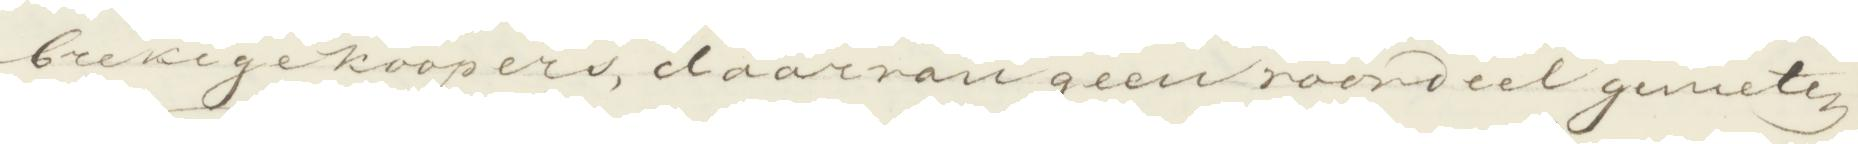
brekige koopers, daarvan geen voordeel genieten
